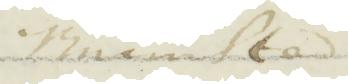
Munster
